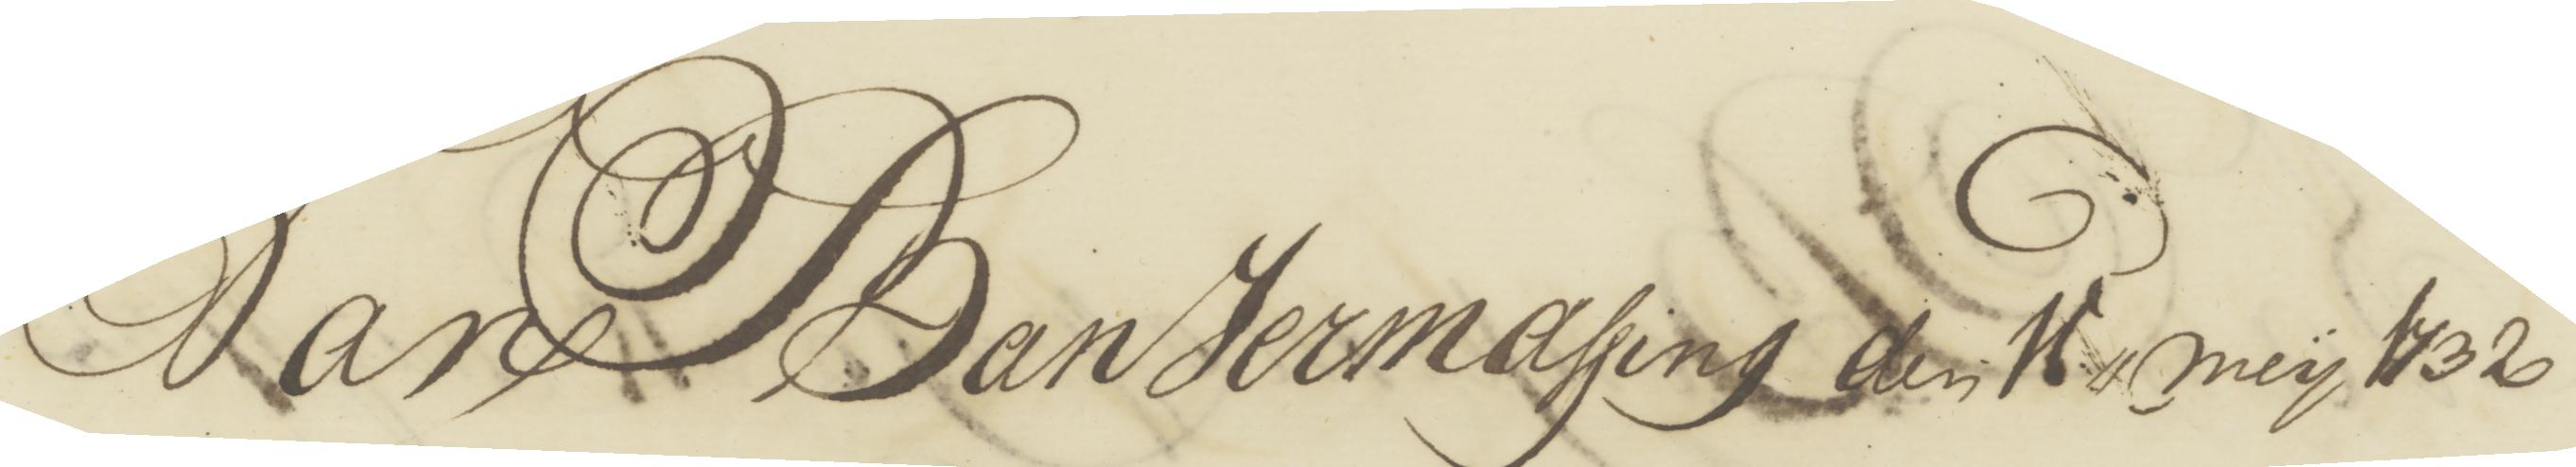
Van Banjermassing den 15„e meij 1732
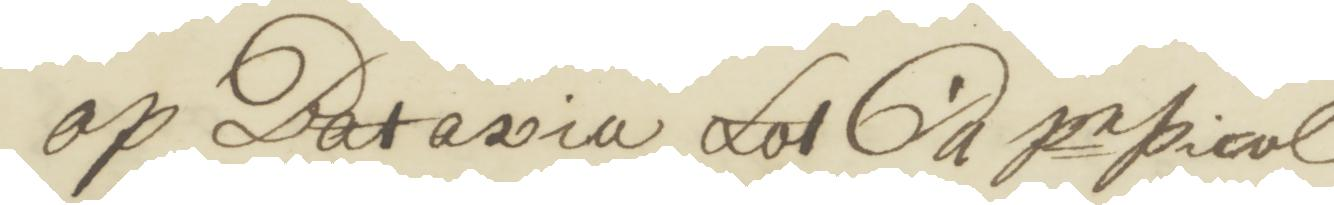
op Batavia tot 6¼ p=r picol
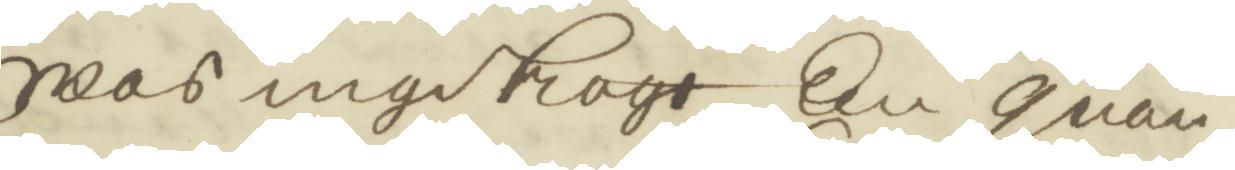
was ingekogt Een quan
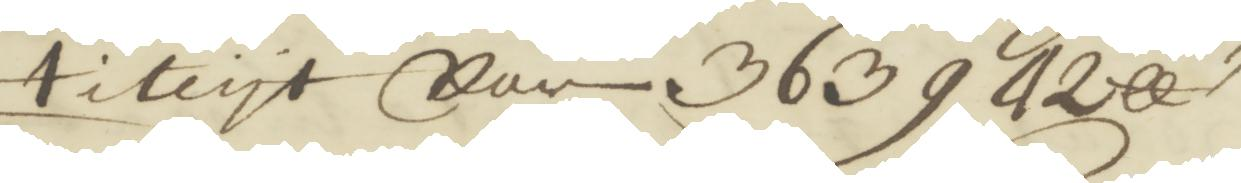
titeijt van 363942lb
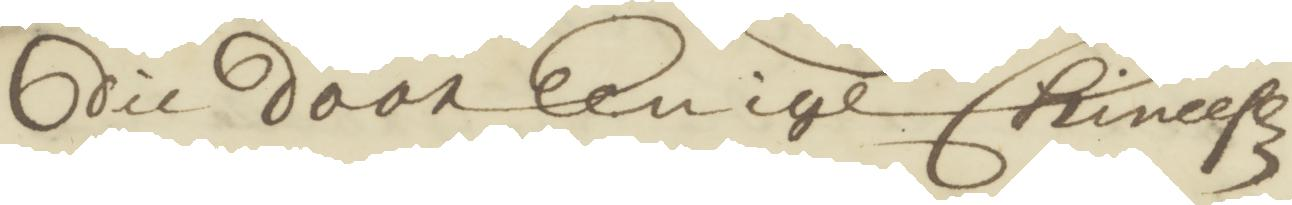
die door Eenige Chineesen
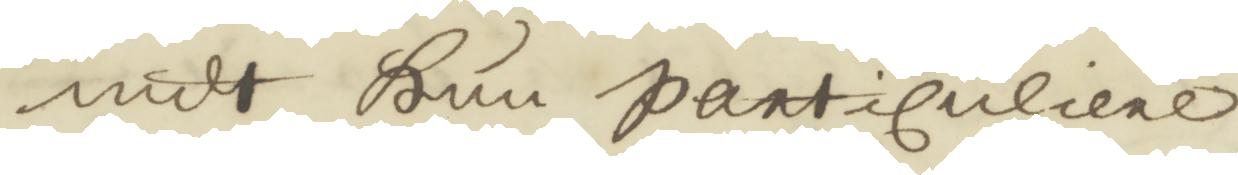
met hun particuliere
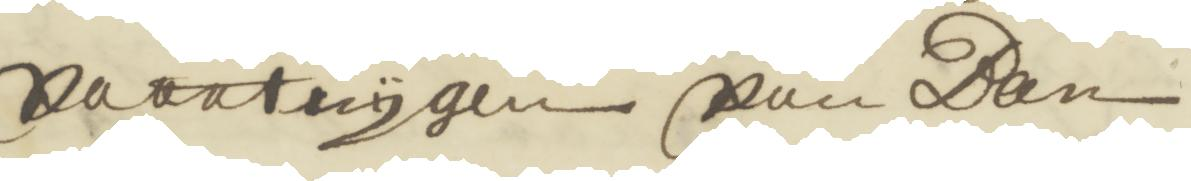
vaartuijgen van Ban
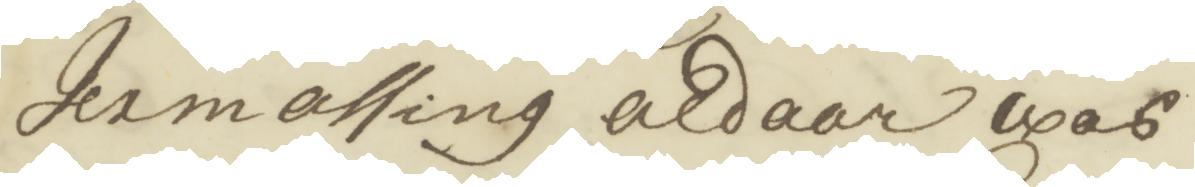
Iermassing aldaar was
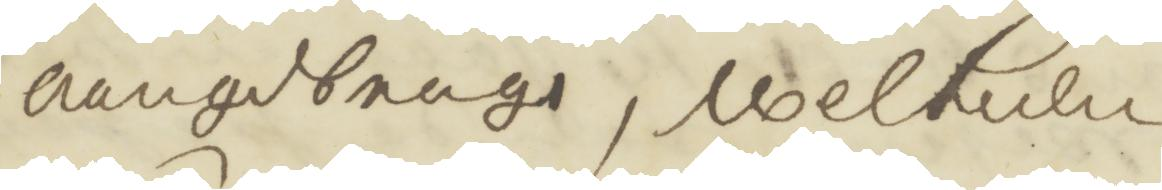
aangebragt, welken
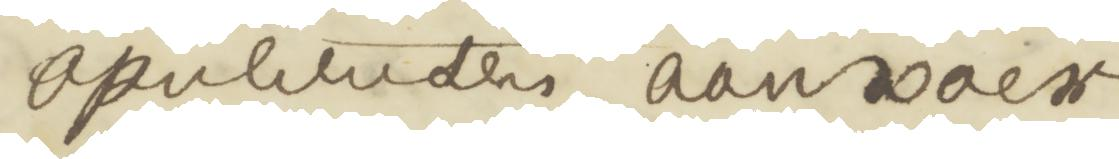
opulenten aanvoer
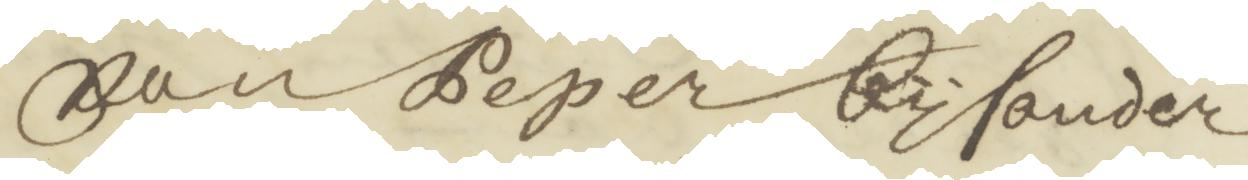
van Peper bijsonder
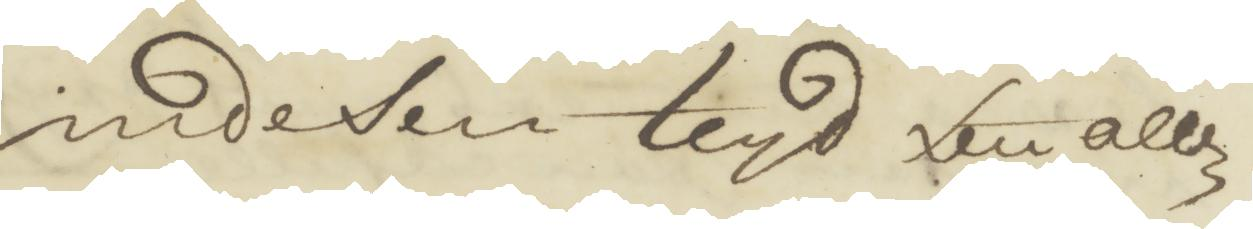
indesen teyd ten allen
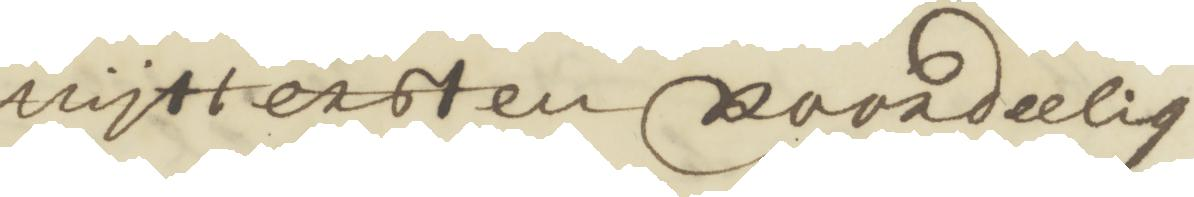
uijttersten voordeelig
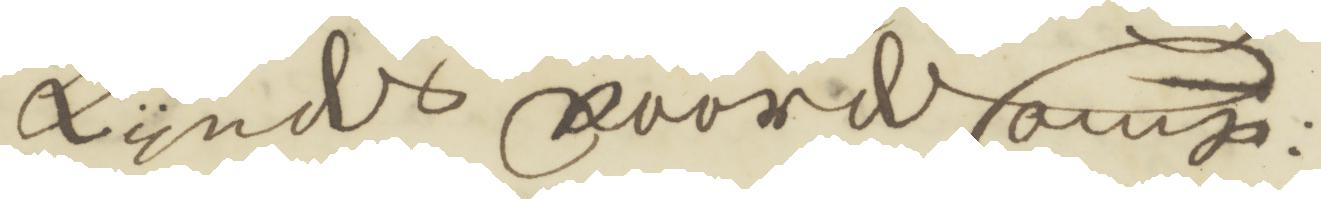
zijnde voor de Comp:
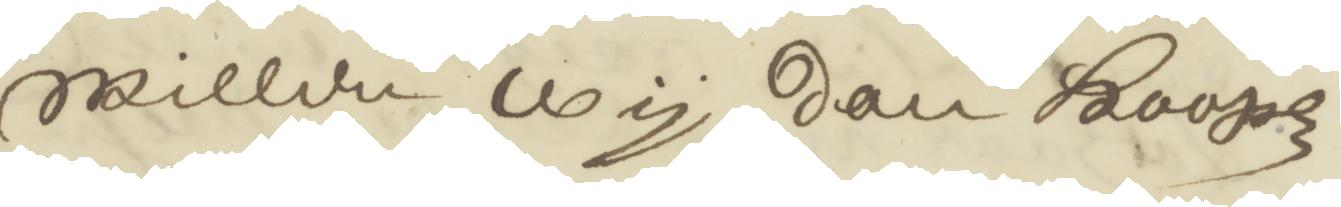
willen wij dan hoopen
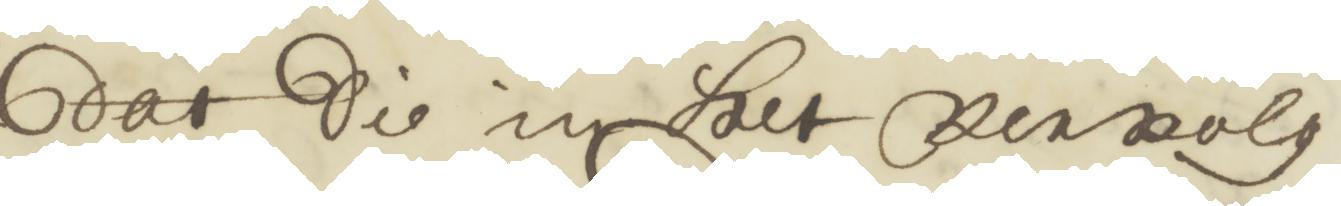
dat die in het vervolg
